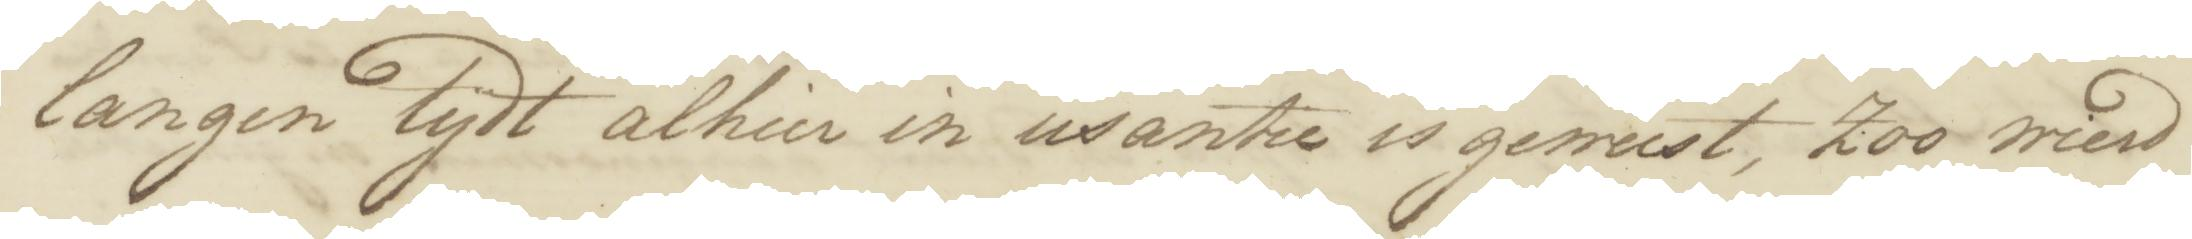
langen tijdt alhier in usantie is geweest, zoo wierd
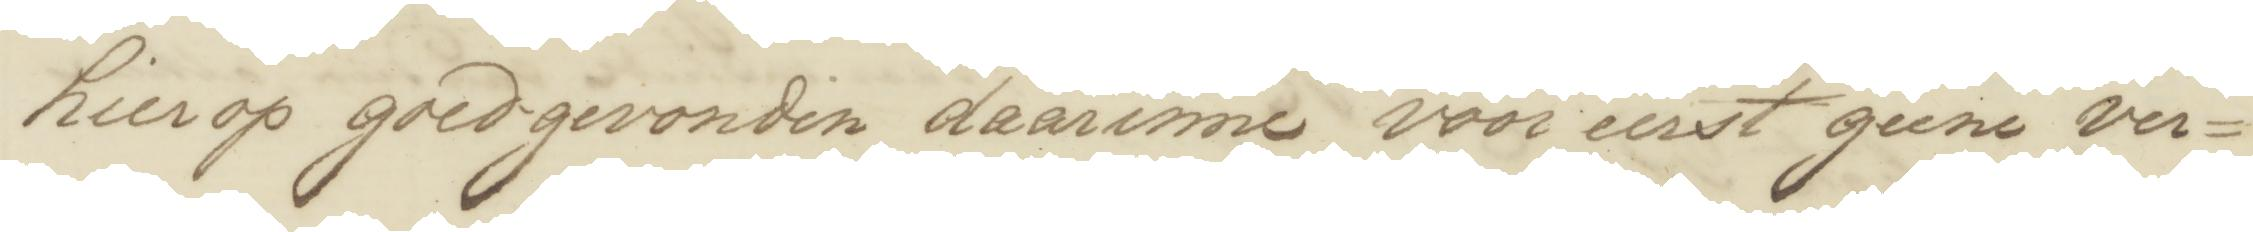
hier op goedgevonden daarinne voor eerst geene ver=
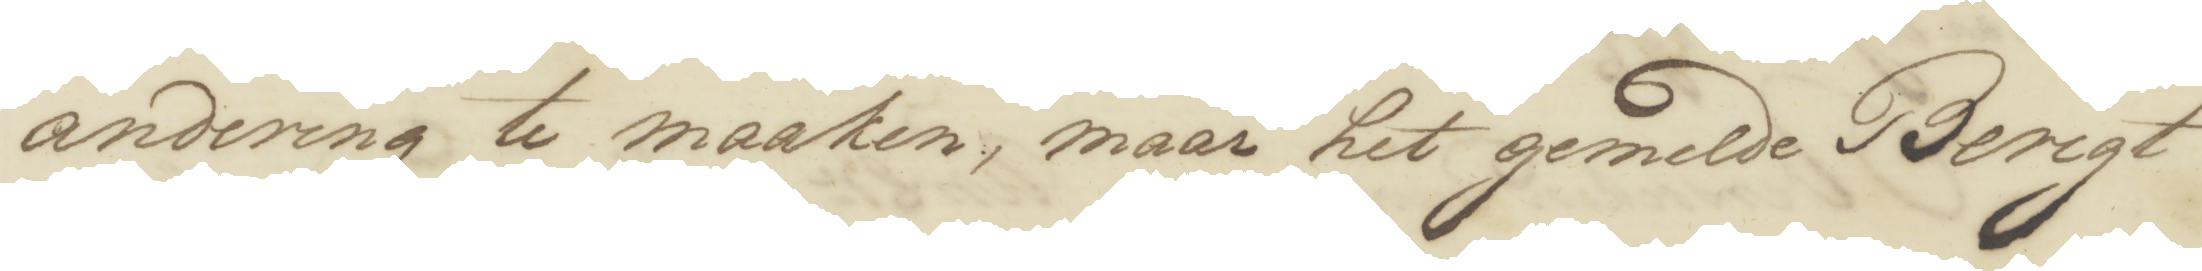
andering te maaken, maar het gemelde Berigt
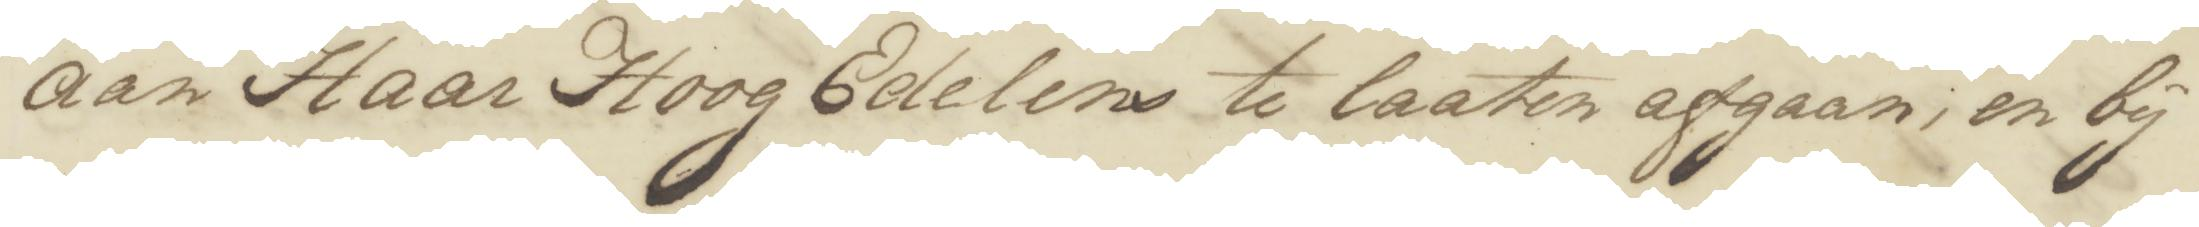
aan Haar Hoog Edelens te laaten afgaan; en bij
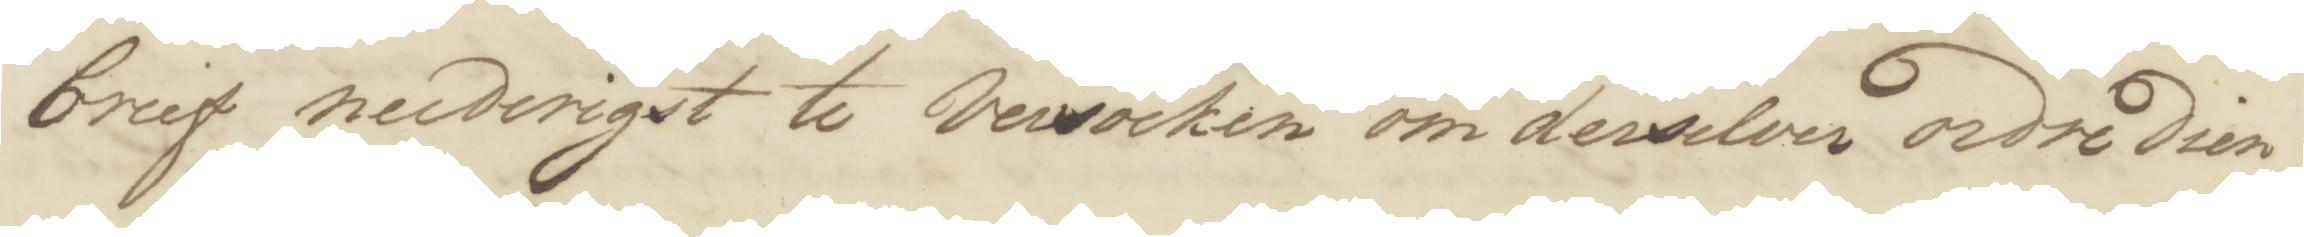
brief neederigst te versoeken om derselver ordre dien
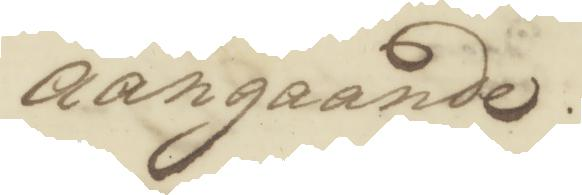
aangaande.
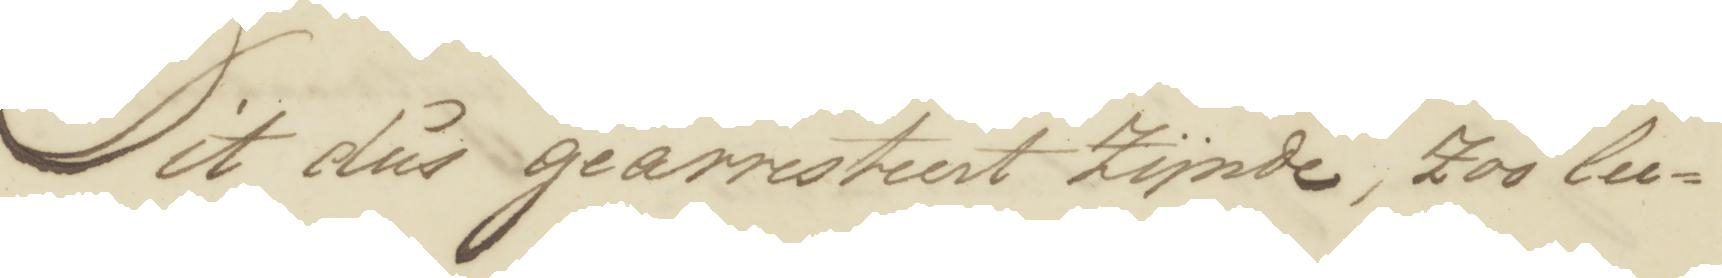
Dit dus gearresteert zijnde, zoo lee=
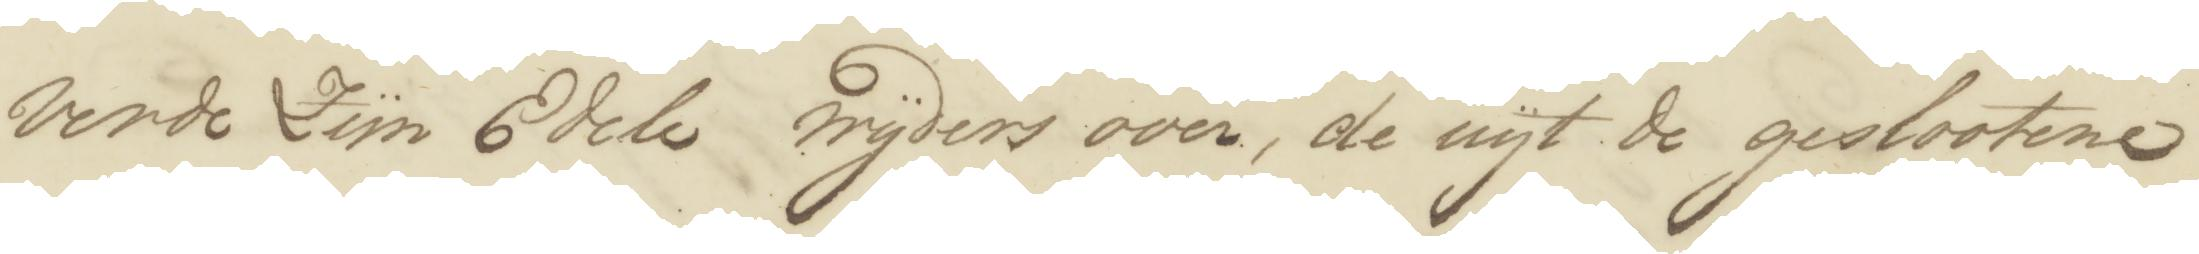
verde zijn Edele wijders over, de uijt de geslootene
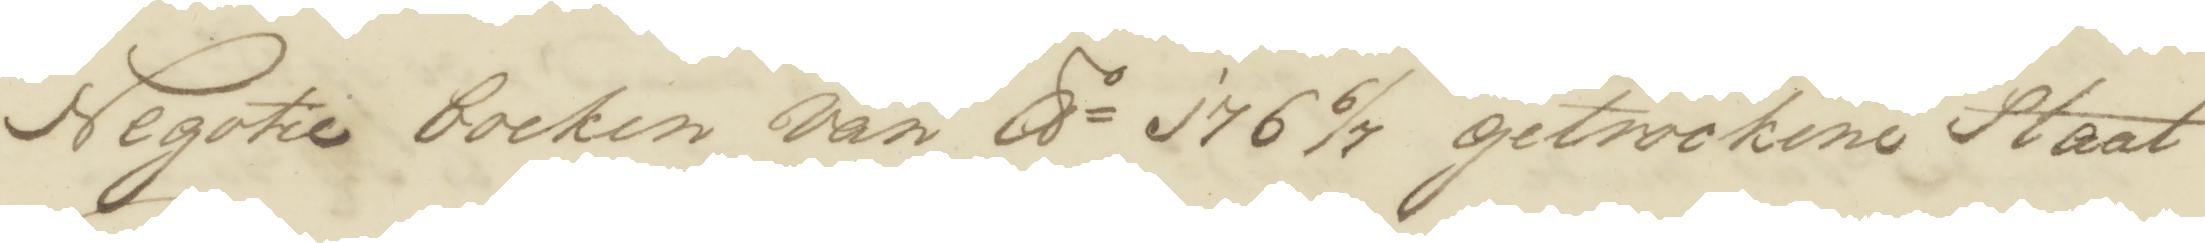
Negotie boeken van A=o 176 6/7 getrockene staat
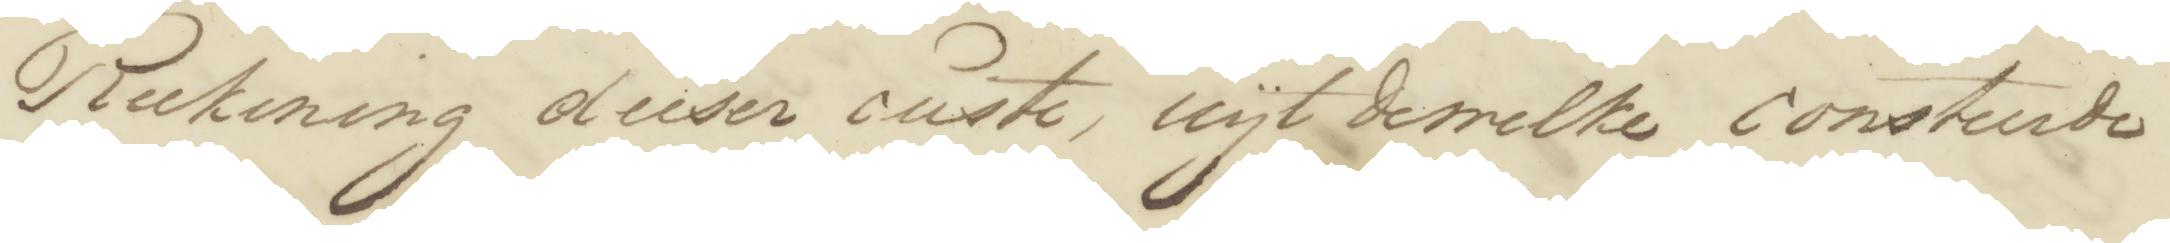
Reekening deeser custe, uijt dewelke consteerde
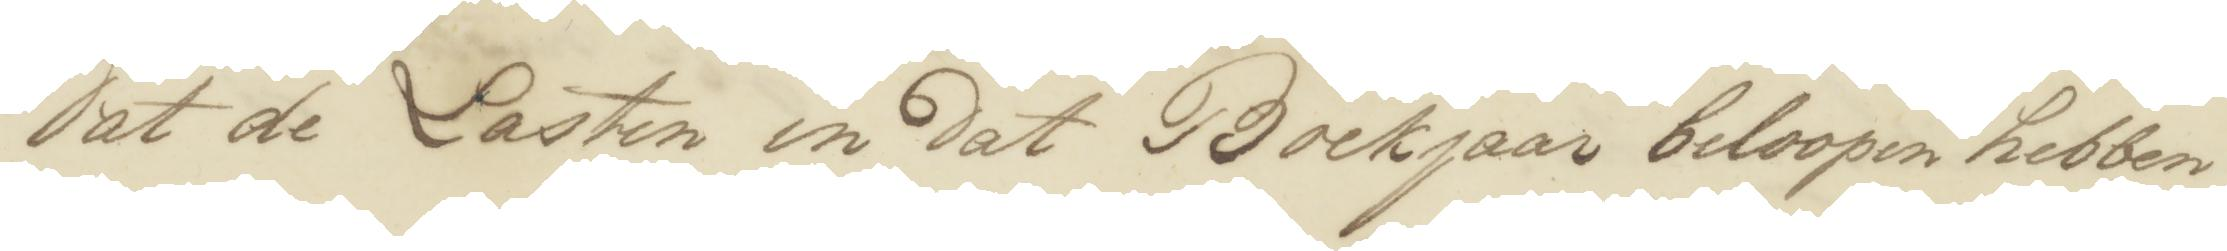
dat de Lasten in dat Boekjaar beloopen hebben
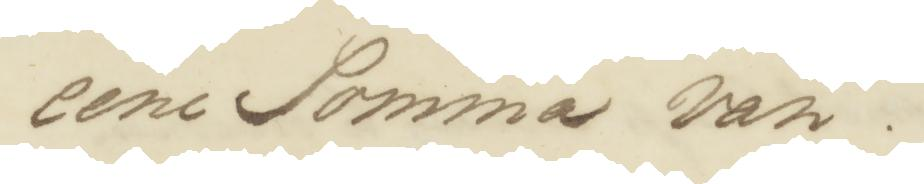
eene Somma van . . . . . . . . ƒ 153'541: 8: 8:
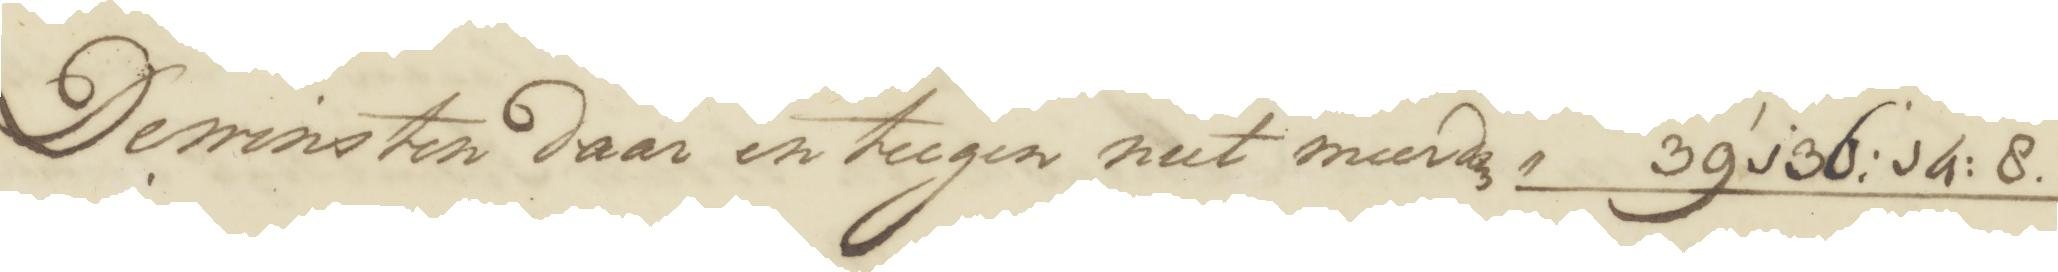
Dewinsten daar en teegen niet meer dan „ 39'136: 14: 8.
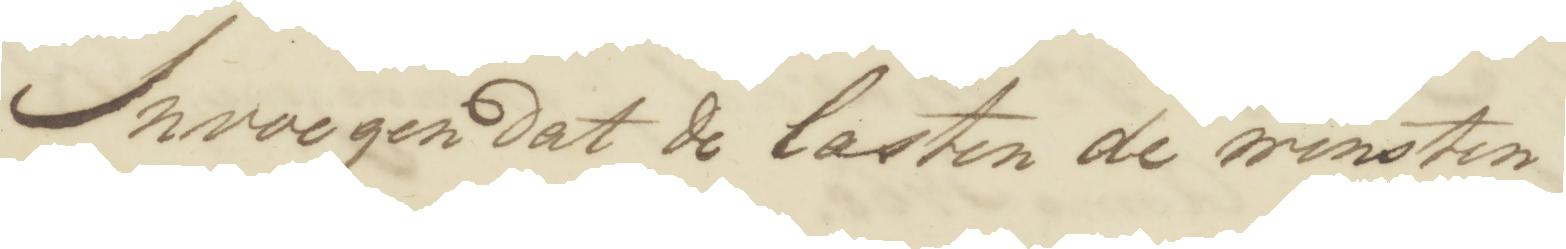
Jnvoegen dat de lasten de winsten
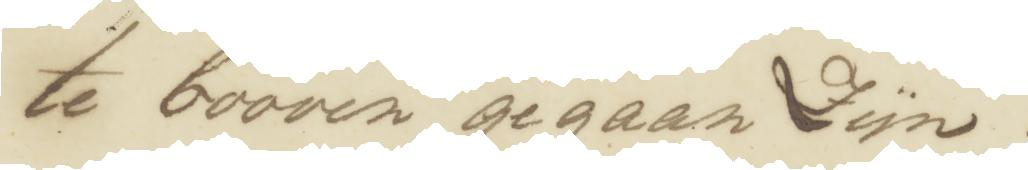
te booven gegaan zijn . . . . . . . „ 114'404: 14 –
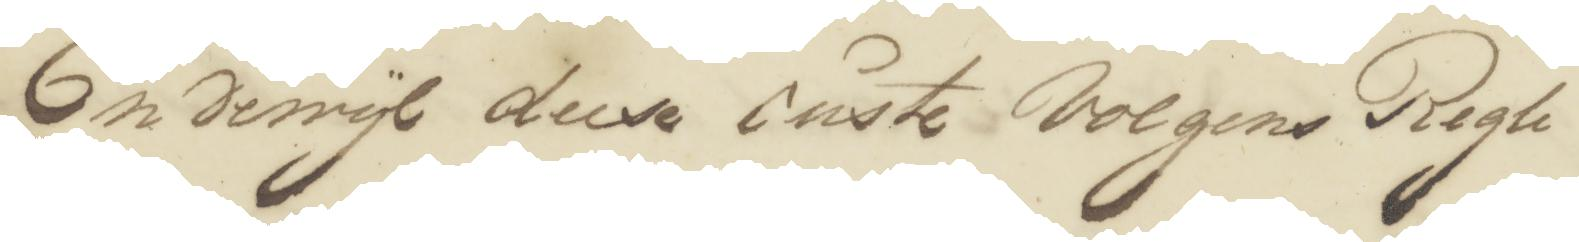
En dewijl deese custe volgens Regte
